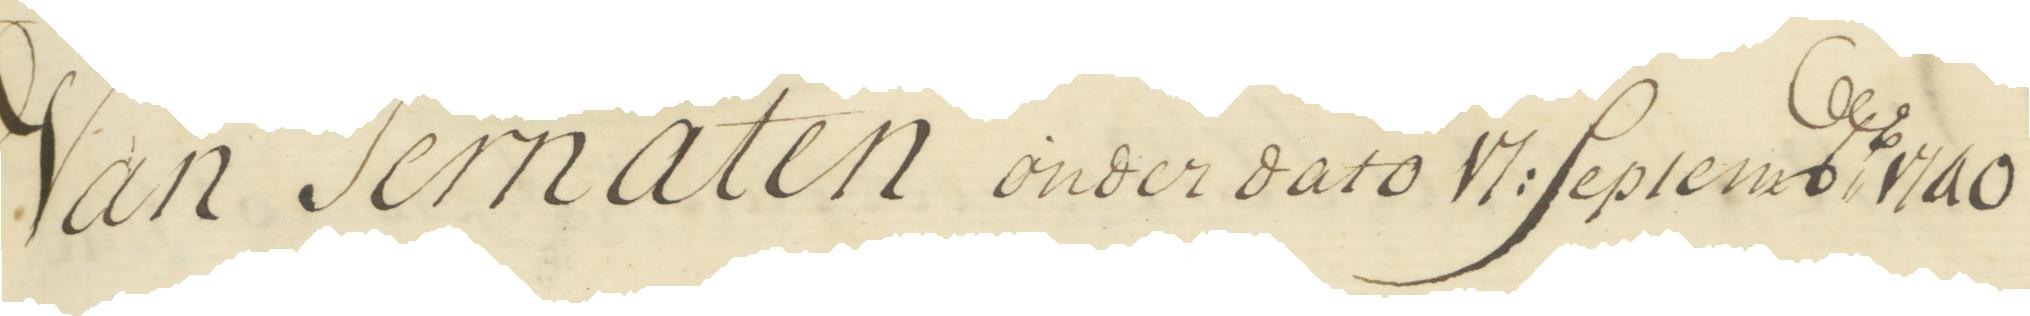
Van Ternaten onder dato 17: Septemb:r 1740
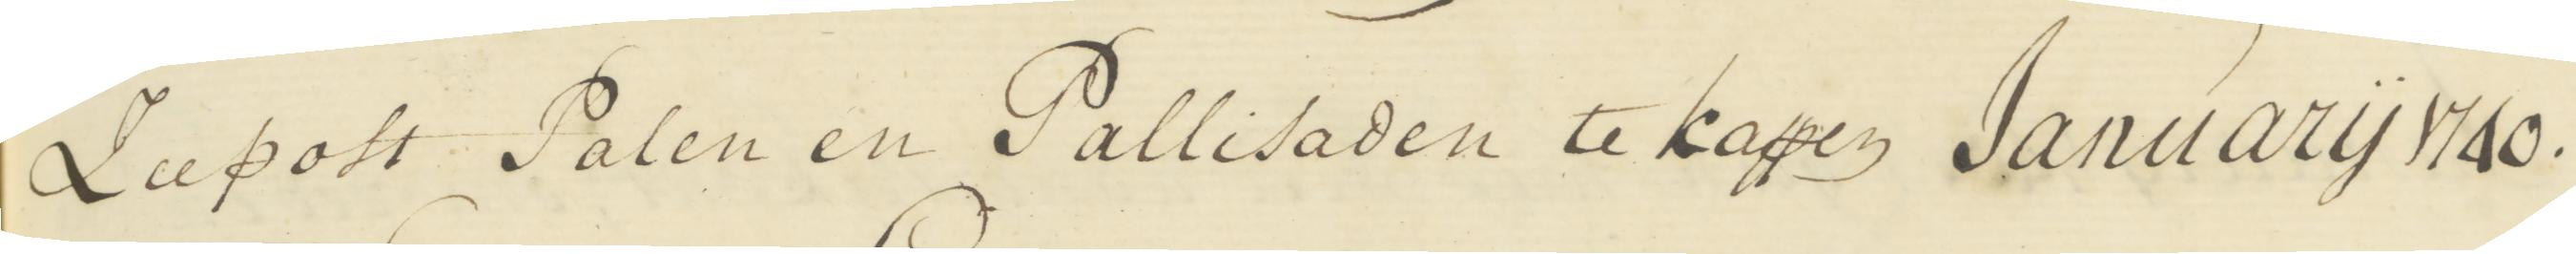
Zeepost Palen en Pallisaden te kappen Januarij 1740.
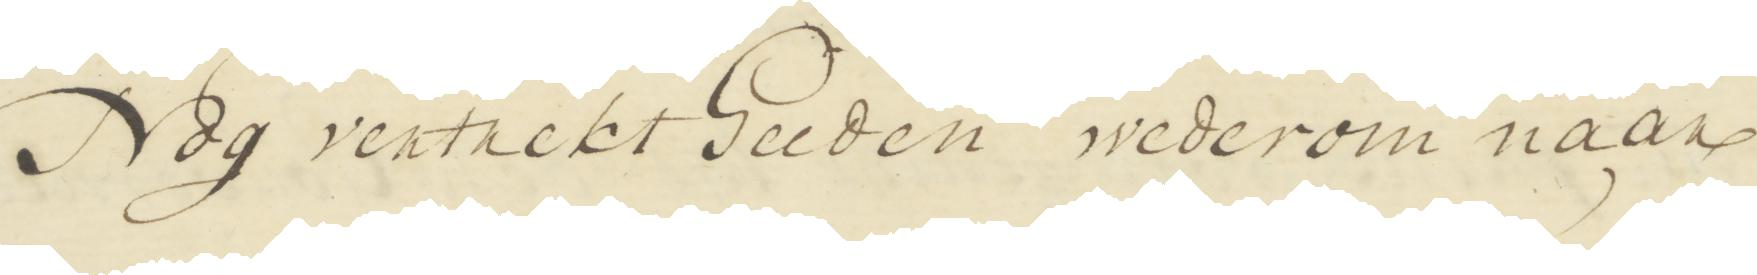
Nog vertrekt heeden wederom naar
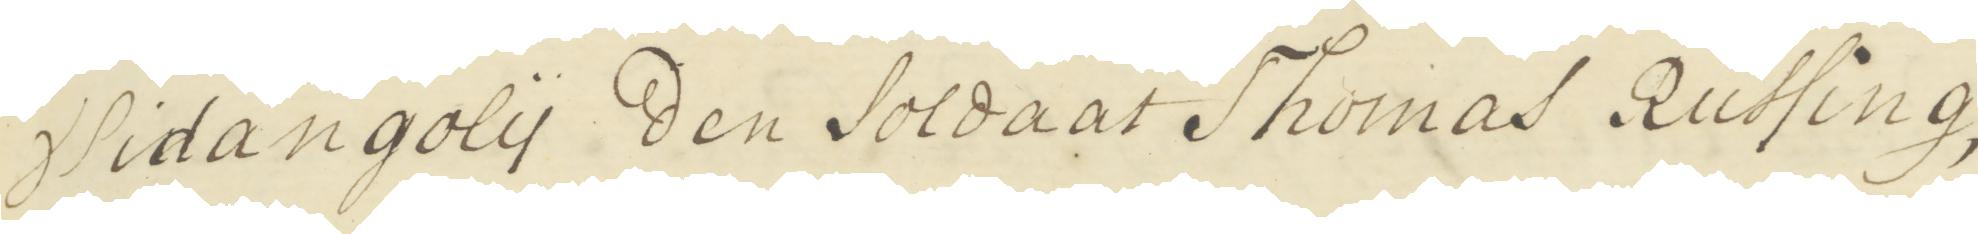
Widangolij den soldaat Thomas Russing
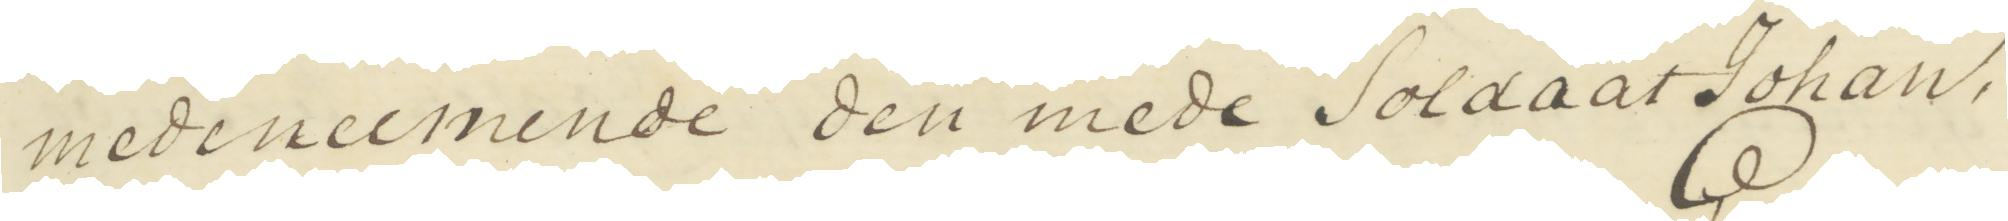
medeneemende den mede soldaat Iohan,
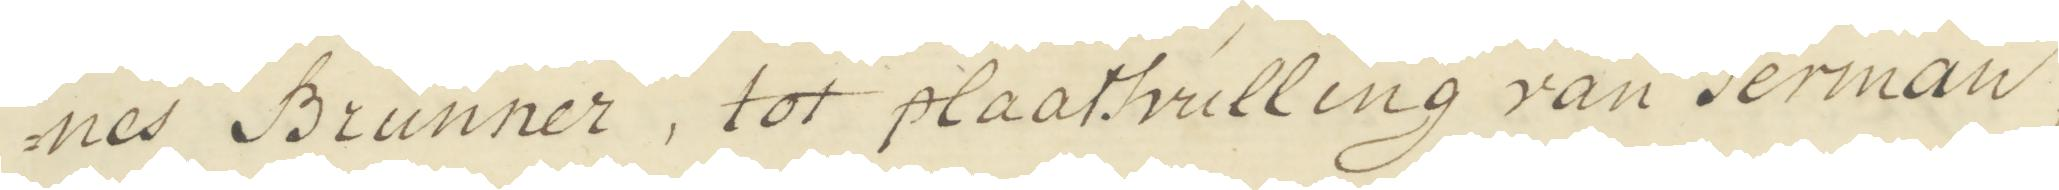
=nes Brunner, tot plaatsvulling van German
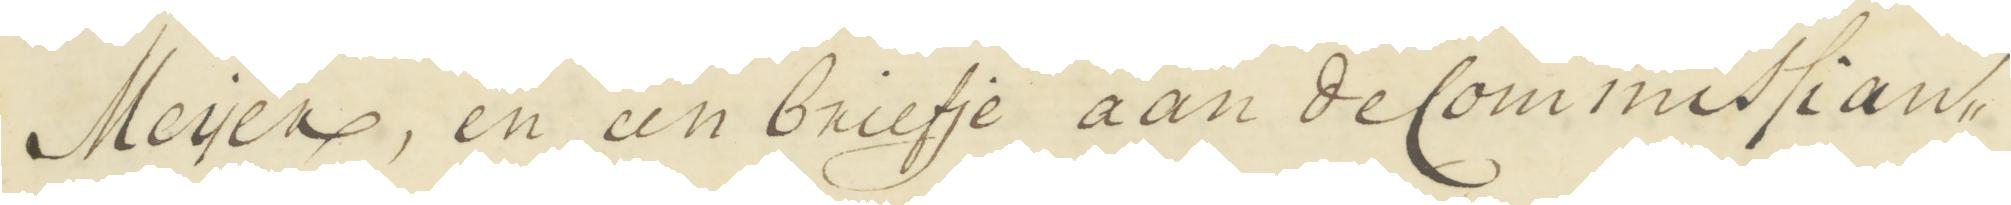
Meijer, en een briefje aan de Commissian„
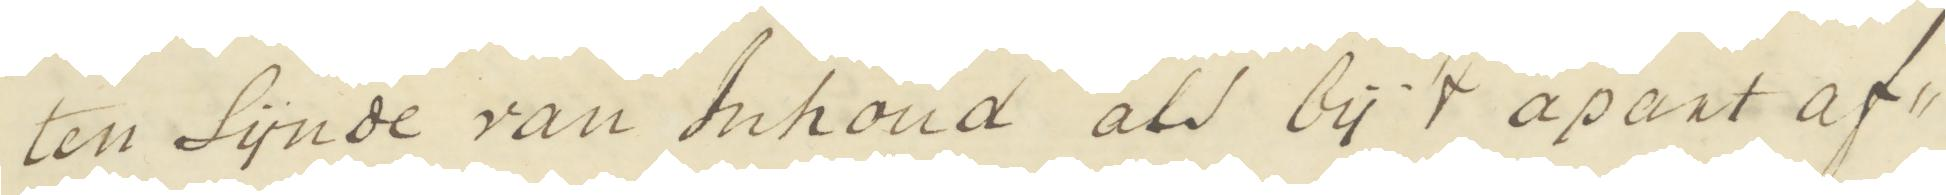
ten sijnde van Inhoud als bij ’t apart af„
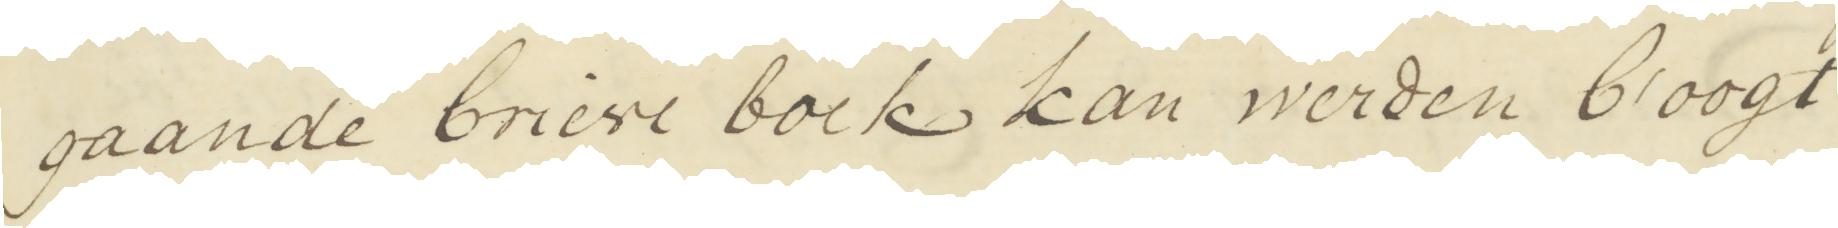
gaande brieve boek kan werden b'oogt
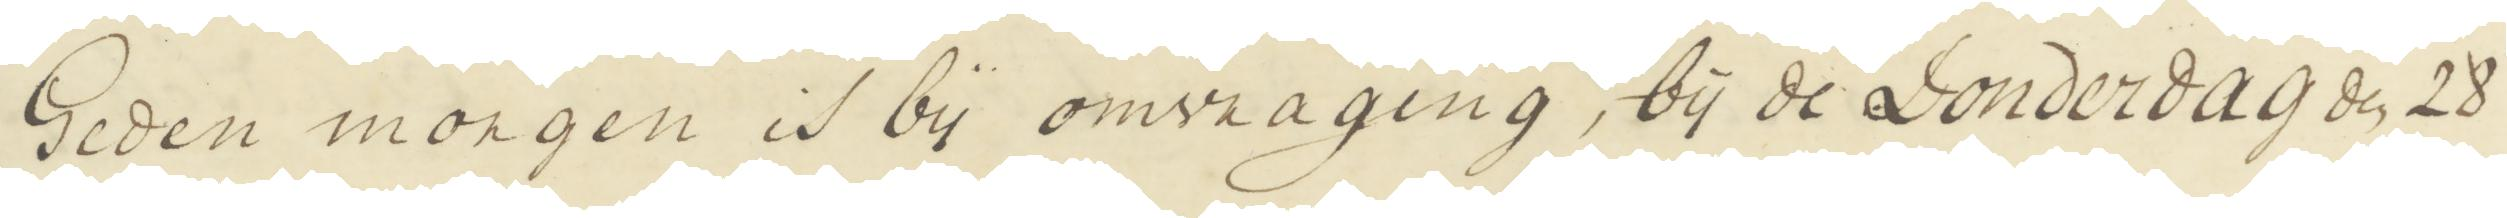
heden morgen is bij omvraging, bij de Donderdag den 28
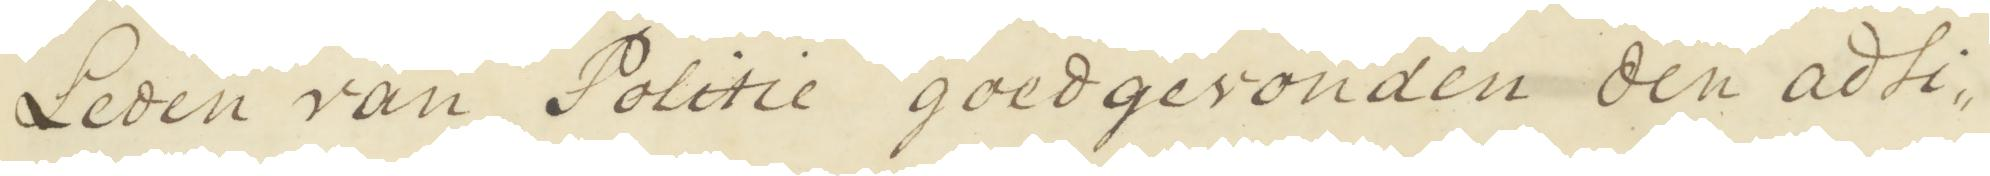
Leden van Politie goedgevonden den adsi„
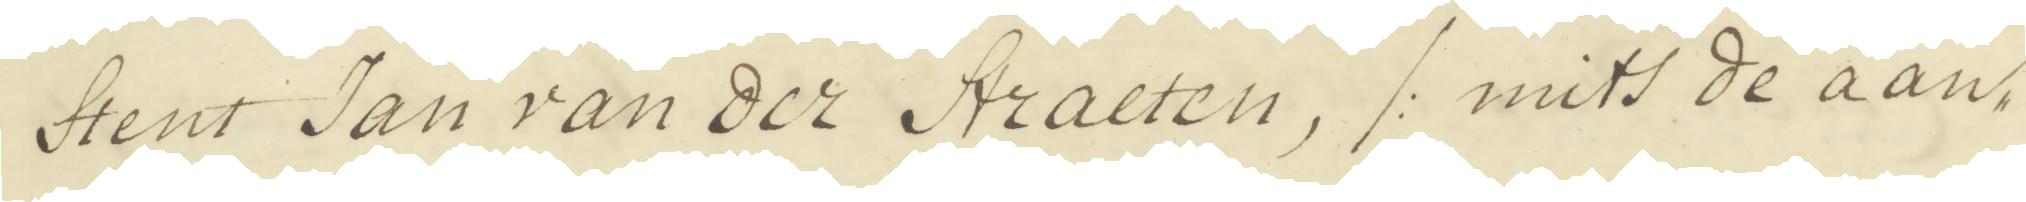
stent Ian van der Straeten, /: mits de aan„
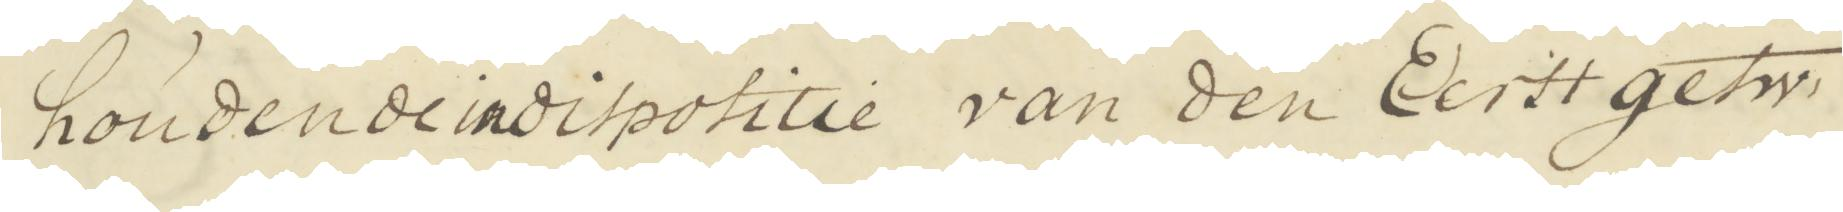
houdende indispositie van den Eerst gesw:
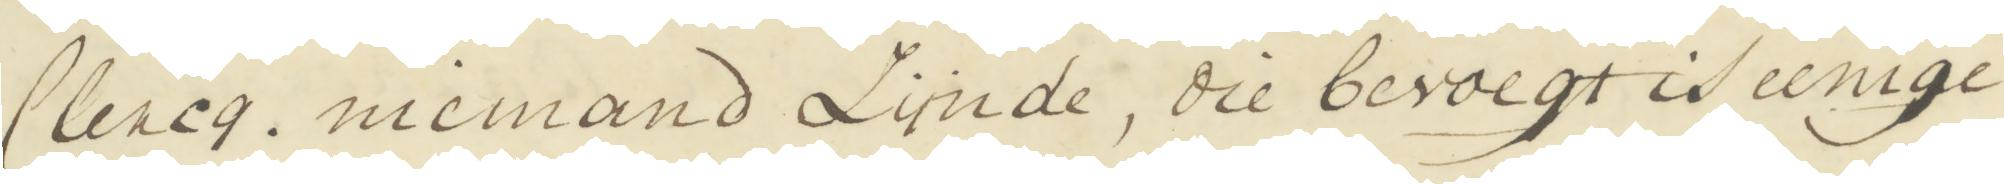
Clercq. niemand zijnde, die bevoegt is eenige
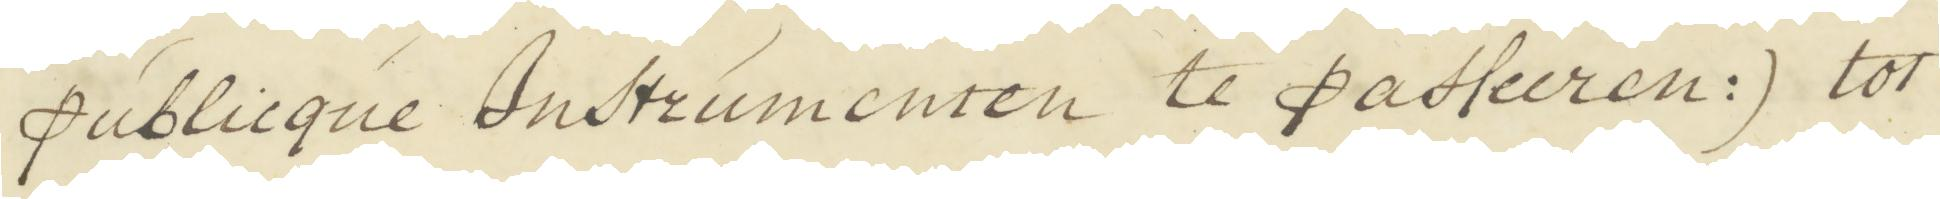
publicque Instrumenten te passeeren:) tot
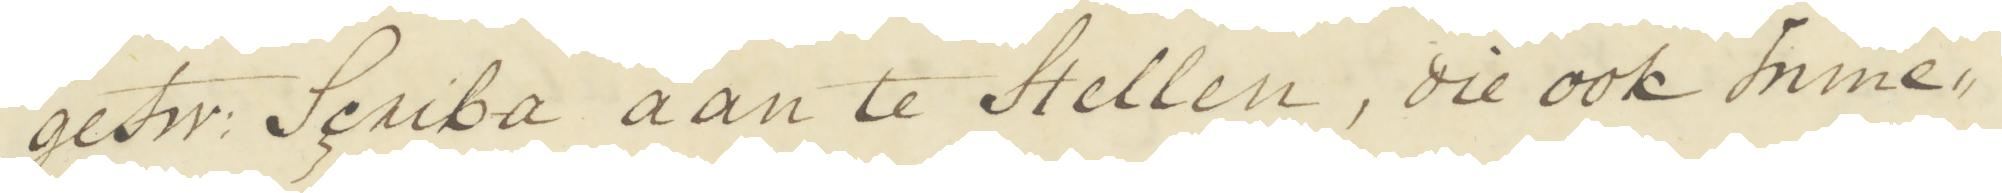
gesw: Scriba aan te stellen, die ook Inme„
